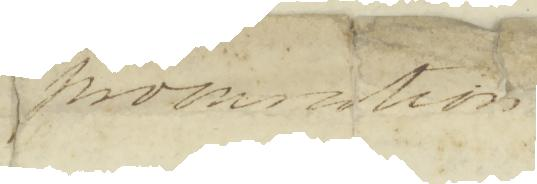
procuration
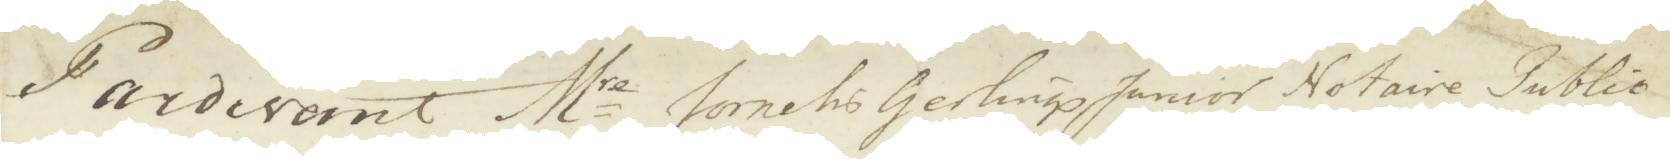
Pardevant M=re Cornelis Gerlings Junior Notaire Public
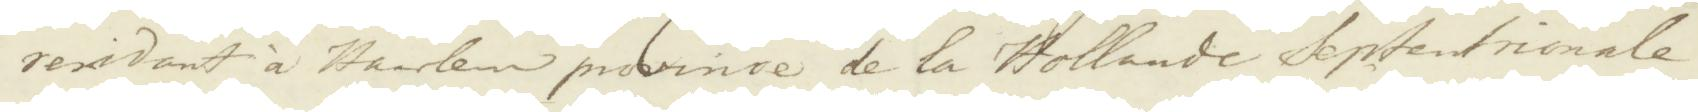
residant à Haarlem province de la Hollande septentrionale
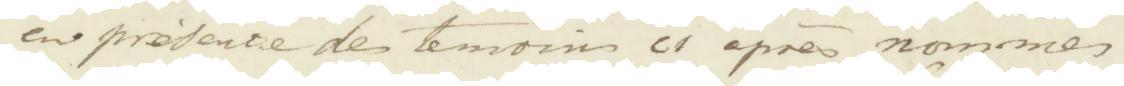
en présente des temoins et apres nommés
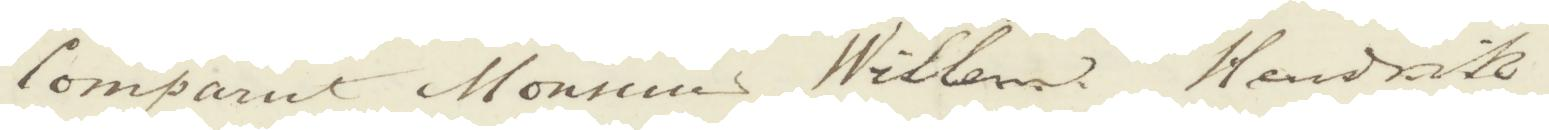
Comparut Monsieur Willem Hendrik
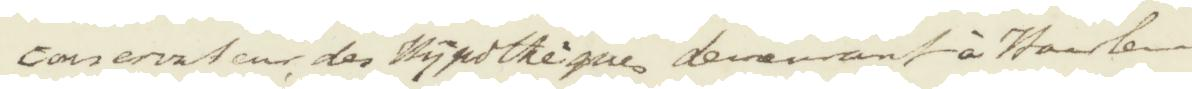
conservateur, des Hijpotheques demeurant à Haarlem
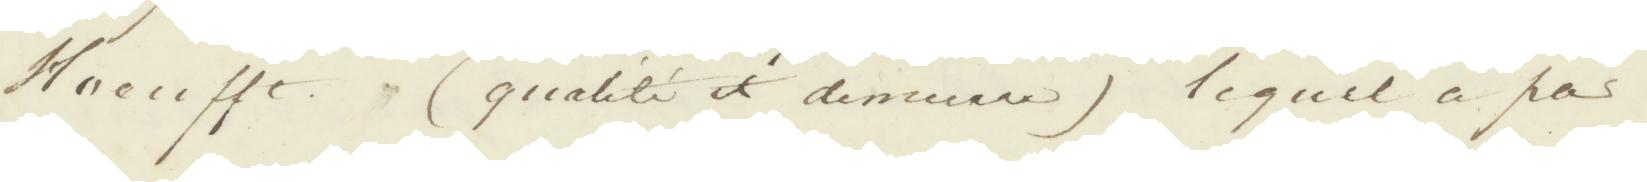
Hoeufft. (qualité et demeurs) lequel a pas
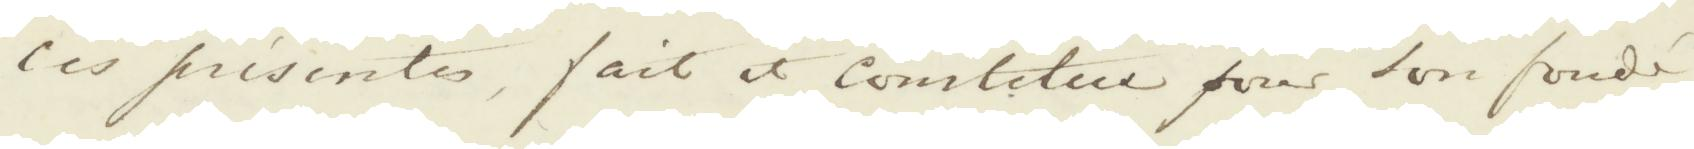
cis présentes, fait et Constitué pour son fondé
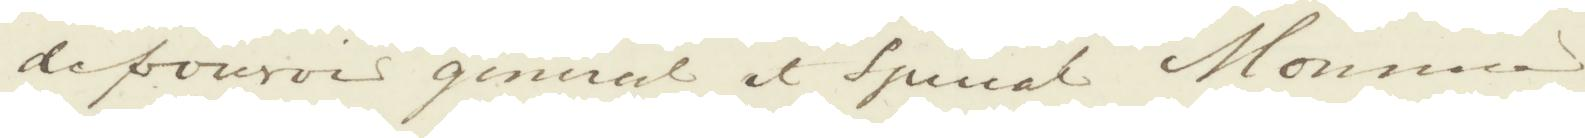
de pouvoir général et spécial Monsieur
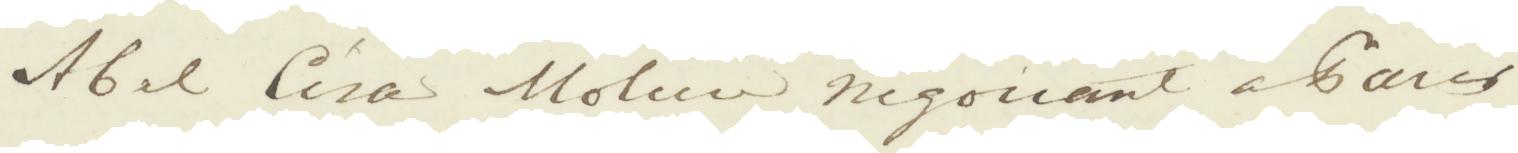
Abel Ciras Moliere négociant à Paris
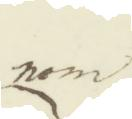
nom
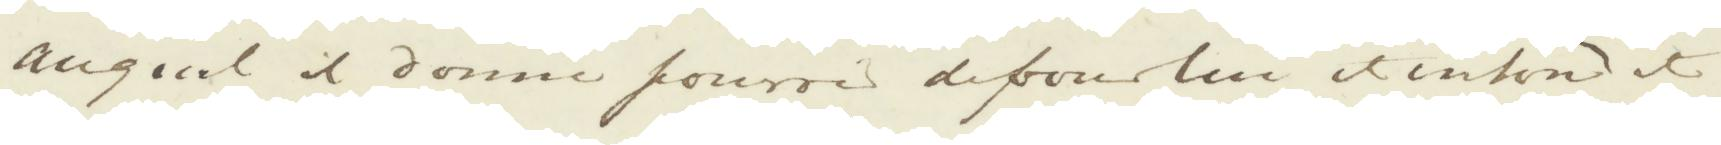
auquel il donne pouvoir di pour lui et en ton et
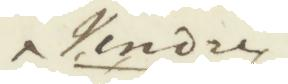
^ Vendre
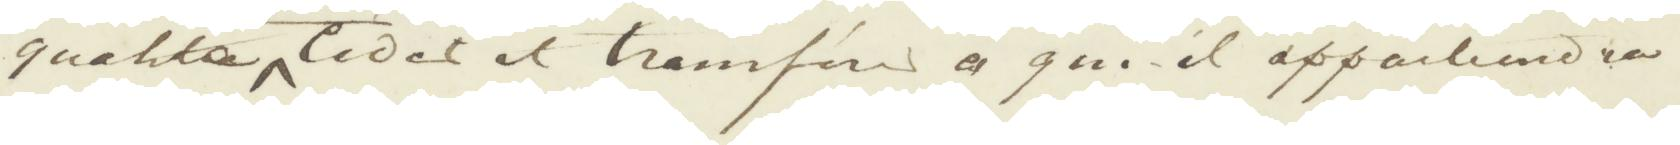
qualité ^ Cedet et transfour à qui-il appartiendra
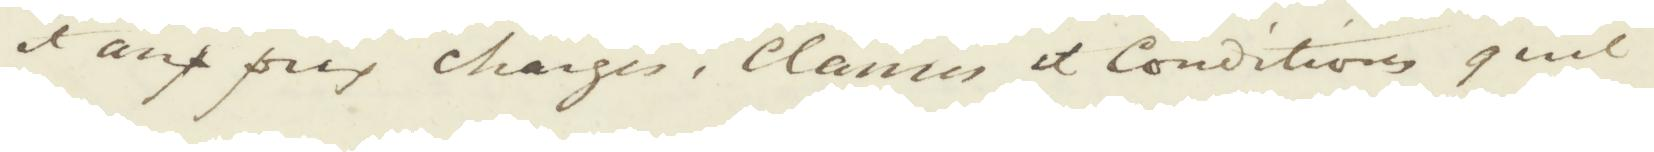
et aux prix charges, Clauses et Conditions quil
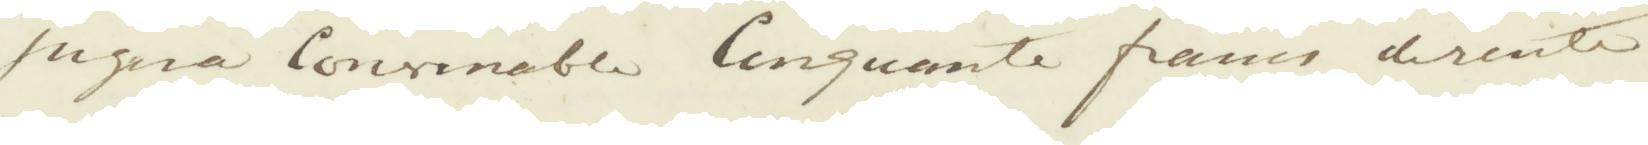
jugera Convinable Cinquante francs directe
